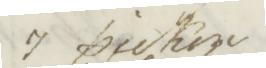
7 pieken
